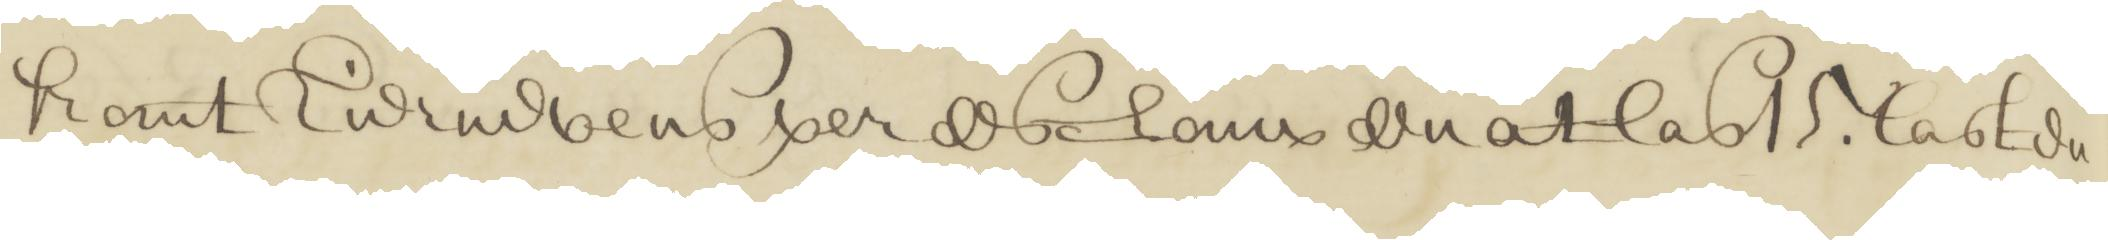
komt hiernevens per de schouw den atlas 15. lasten
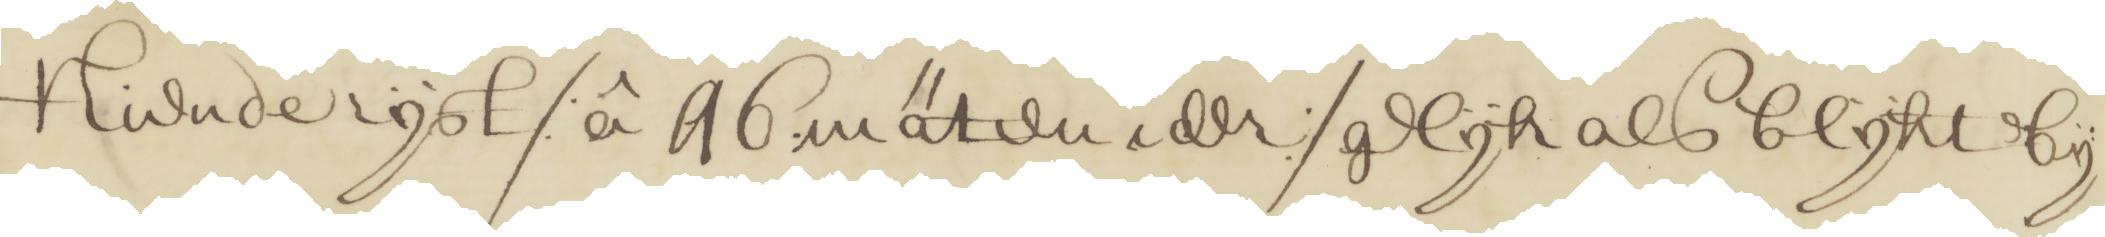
thiende rijst /: â 46: mäten ider:/ gelijk als blijkt bij
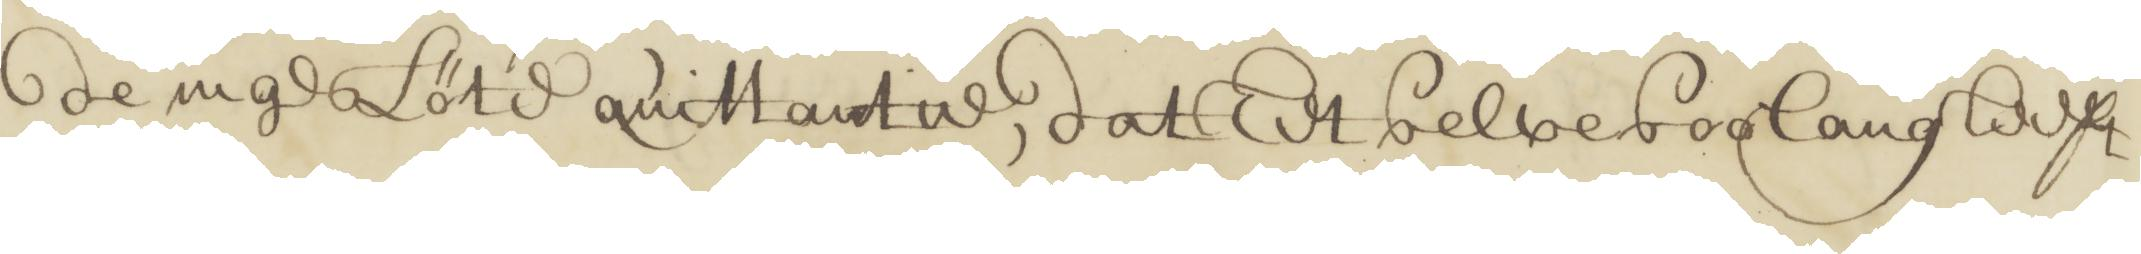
de ingestote quittantie, dat het selve soolang heeft
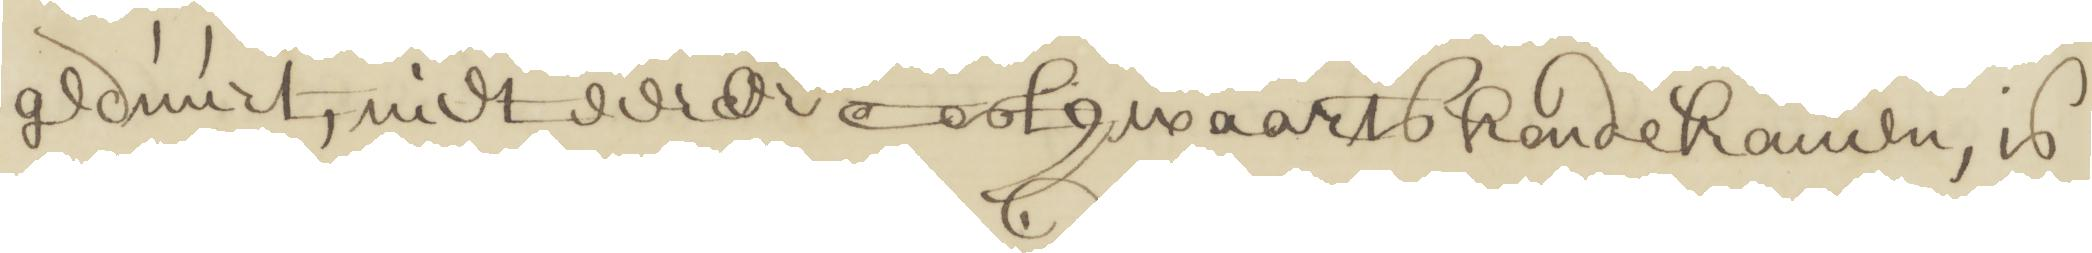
geduurt, niet eerder costijwaarts konde komen, is
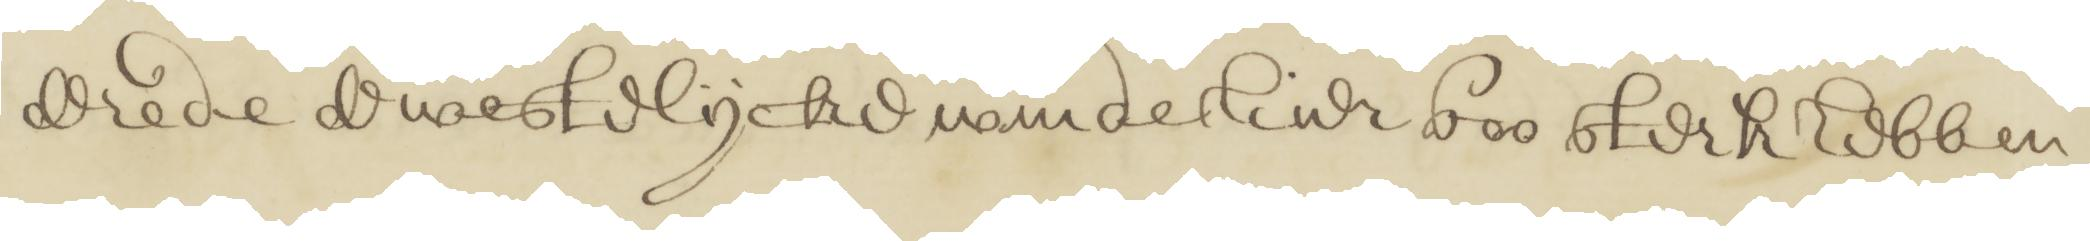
derede de westelijcke winde hier soo sterk hebben
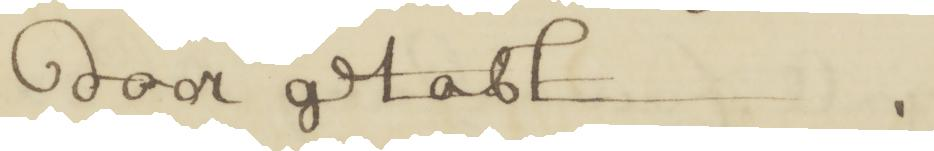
door getast.
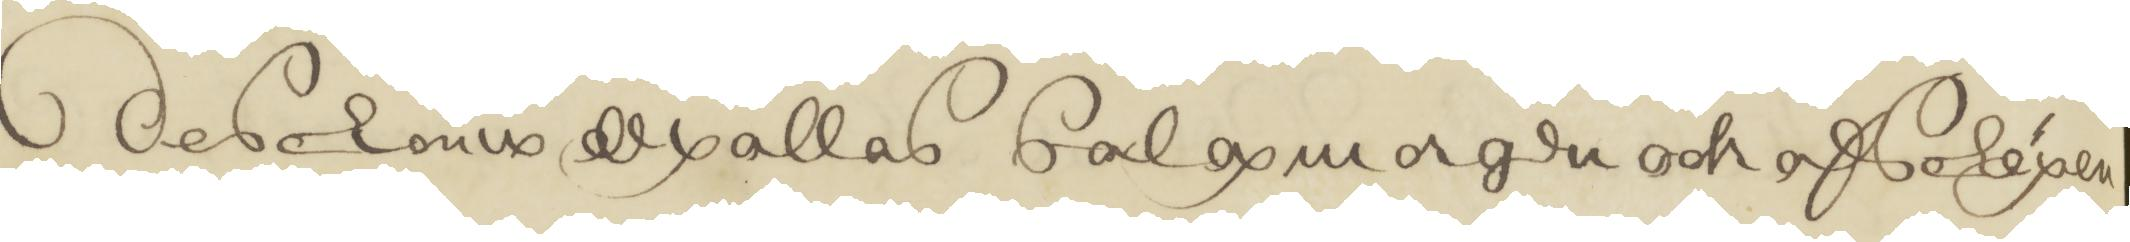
deschouw de pallas sal op morgen ook afschëpen
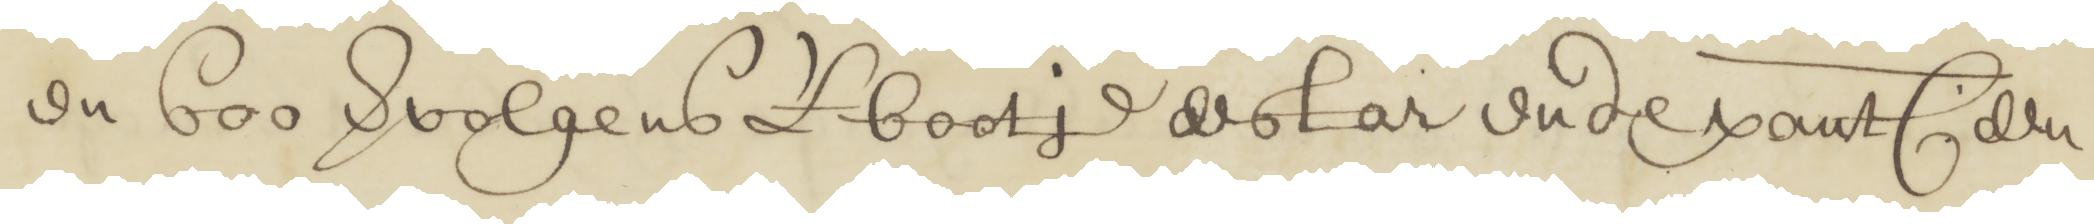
en soo vervolgens 't bootje de star en de pantC: den
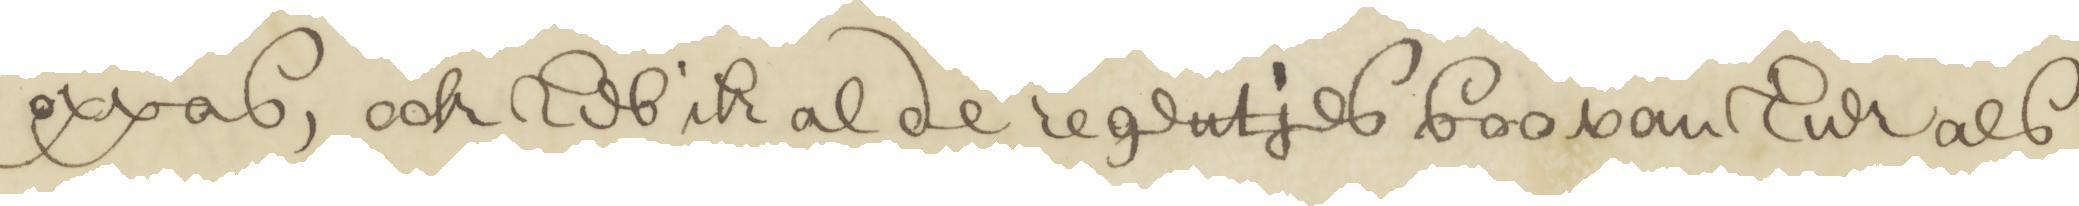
oppas, ook heb ik al de regentjes soo van hier als
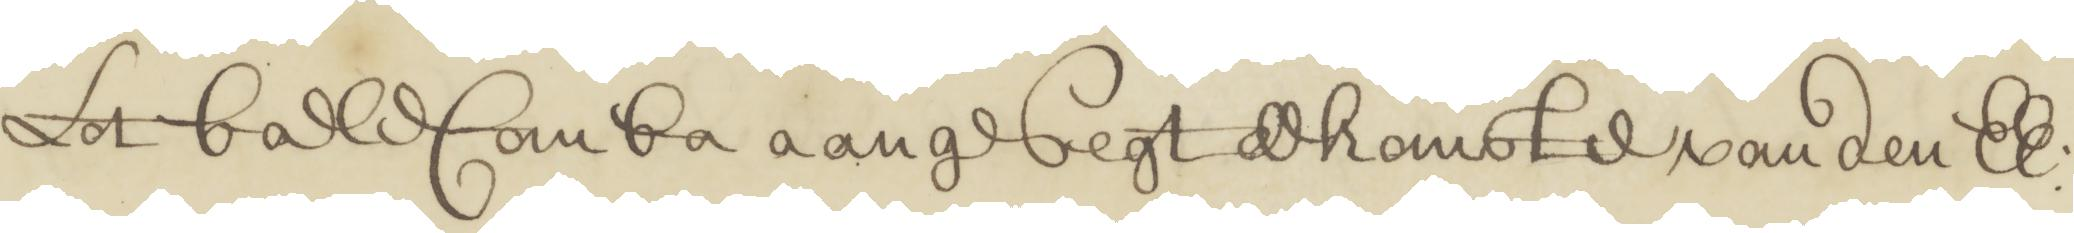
tot boele Comba aangesegt dekomste van den EE
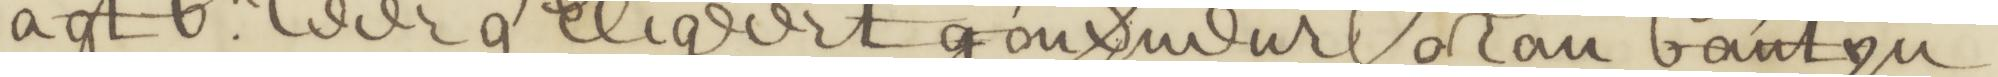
agtb: heer g’Eligeert gouverneur Johan bantijn
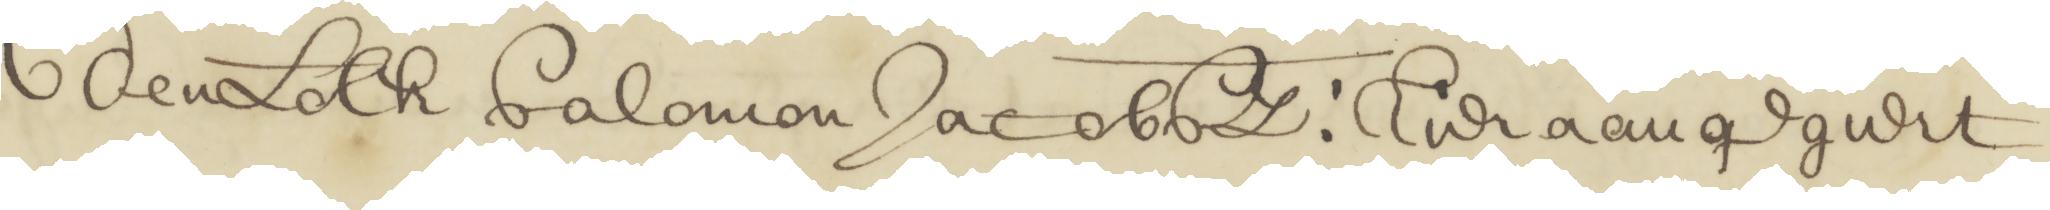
den tolk salomon Jacobsz: hier aangegiert
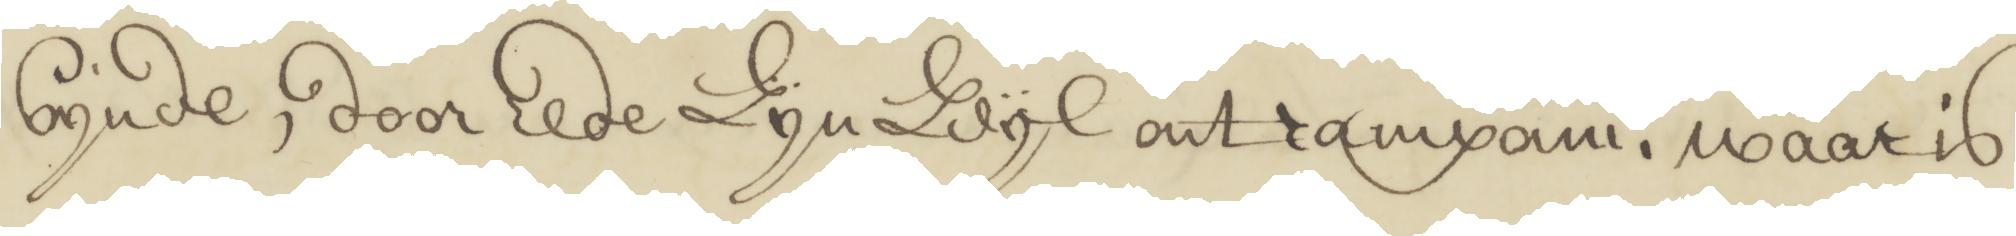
sijnde, door rede zijn zeijl ontrampam:t waar is
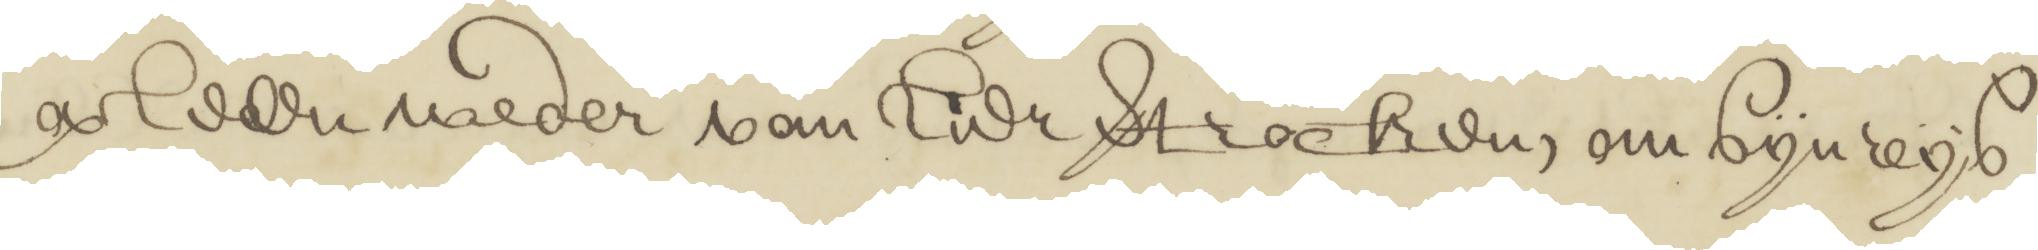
op heden weder van hier vertrocken, om sijn reijs
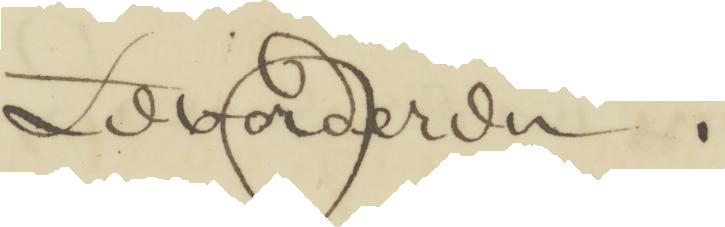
tevorderen.
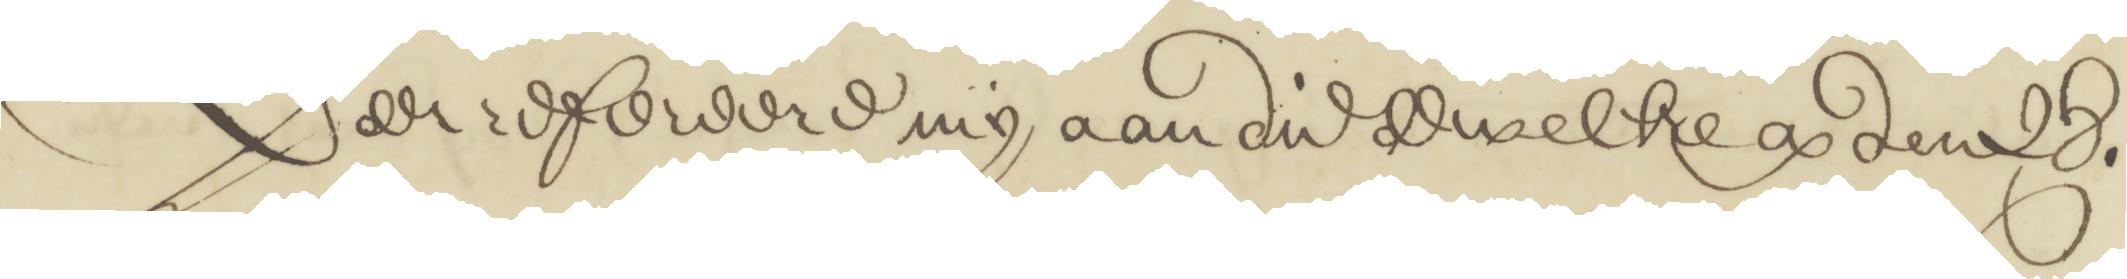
Verder refereere mij aan die dewelke op den 28.
